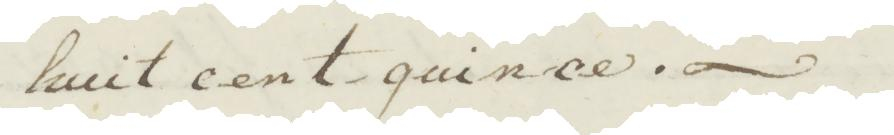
huit cent quin-ce.—
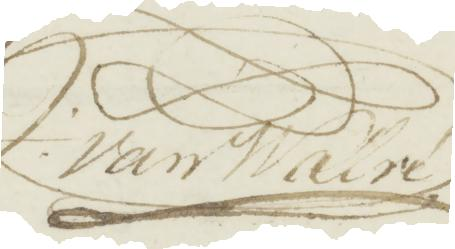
J: van Walré
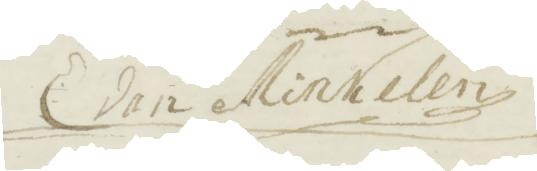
E: van Minkelen
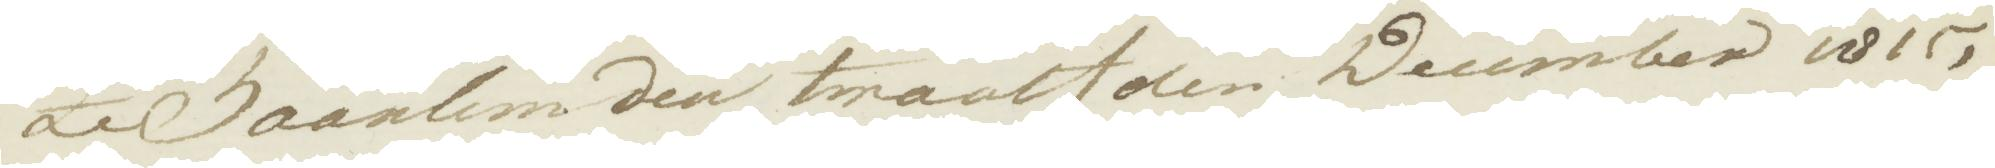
te Haarlem den twaalfden December 1815,
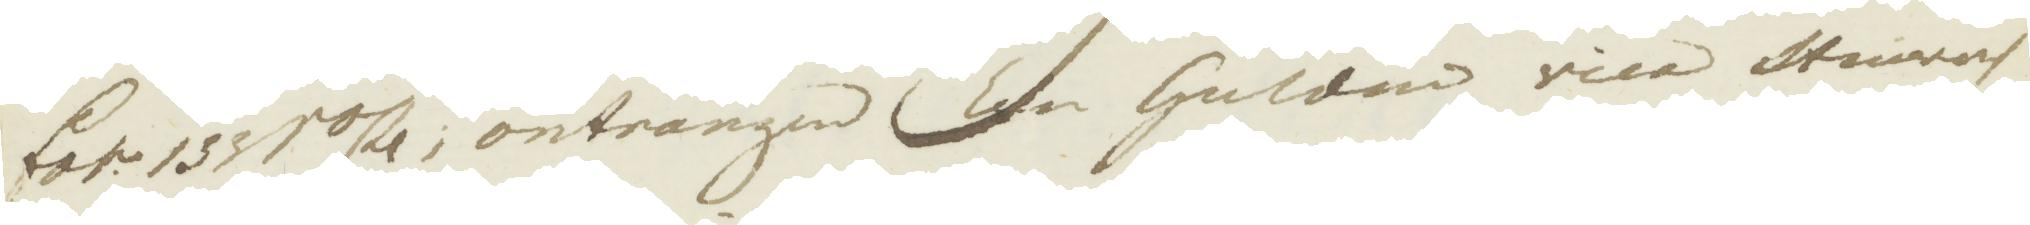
fol. 133 vo C4; ontvangen Een Gulden vier stuivers
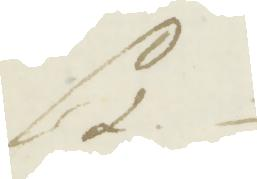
ƒ. 2._
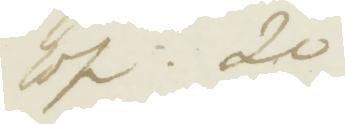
10 1/2: 20
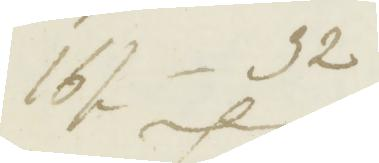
16 1/2 — 32
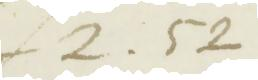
ƒ 2.52
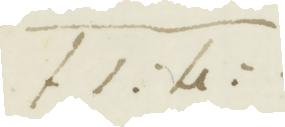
ƒ1: 4:
